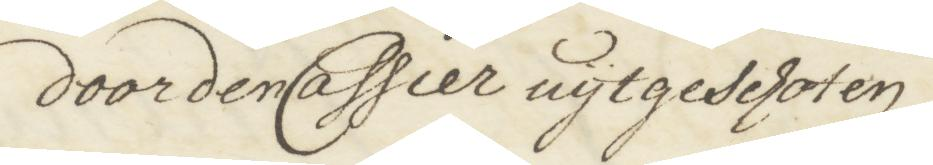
door den Cassier uijtgeschoten
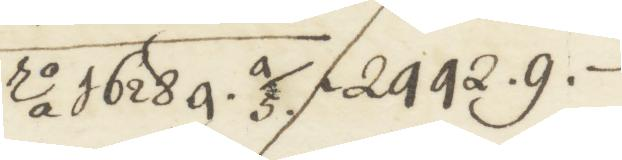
ro/a 16284. 4/5. ƒ2442.9.
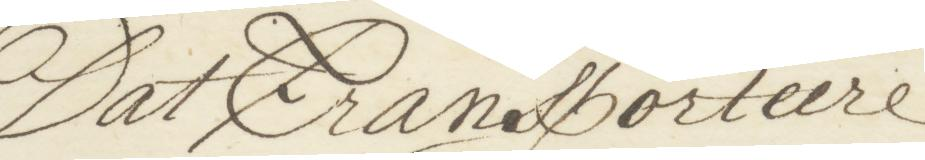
Dat Transporteere
